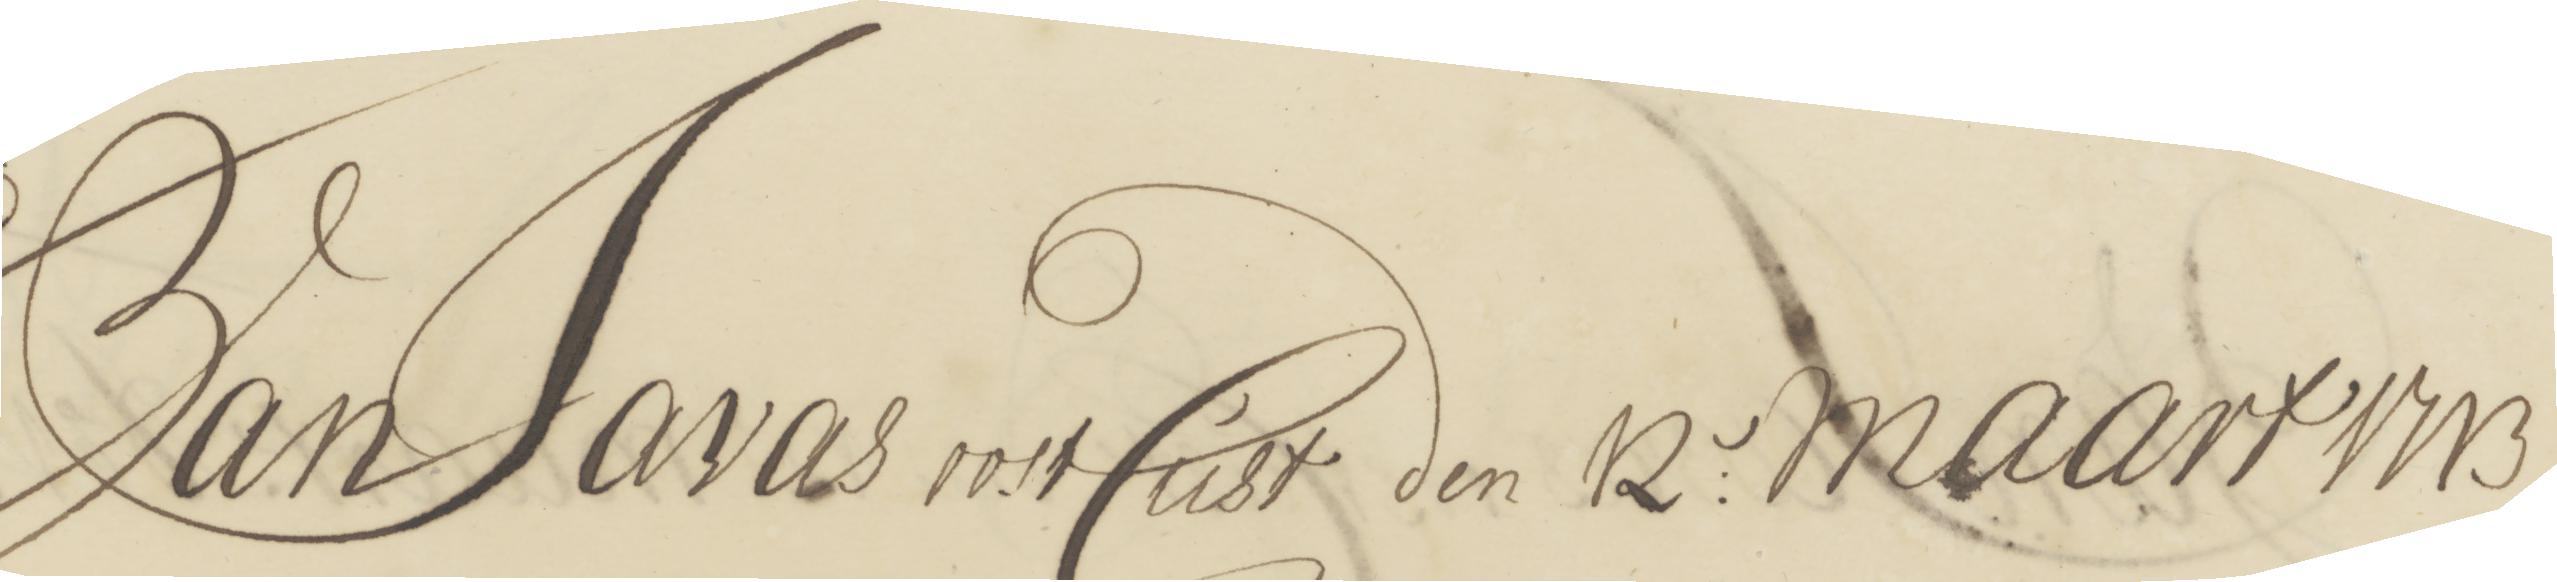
Van Javas oost Cust den 12:' maart 1713
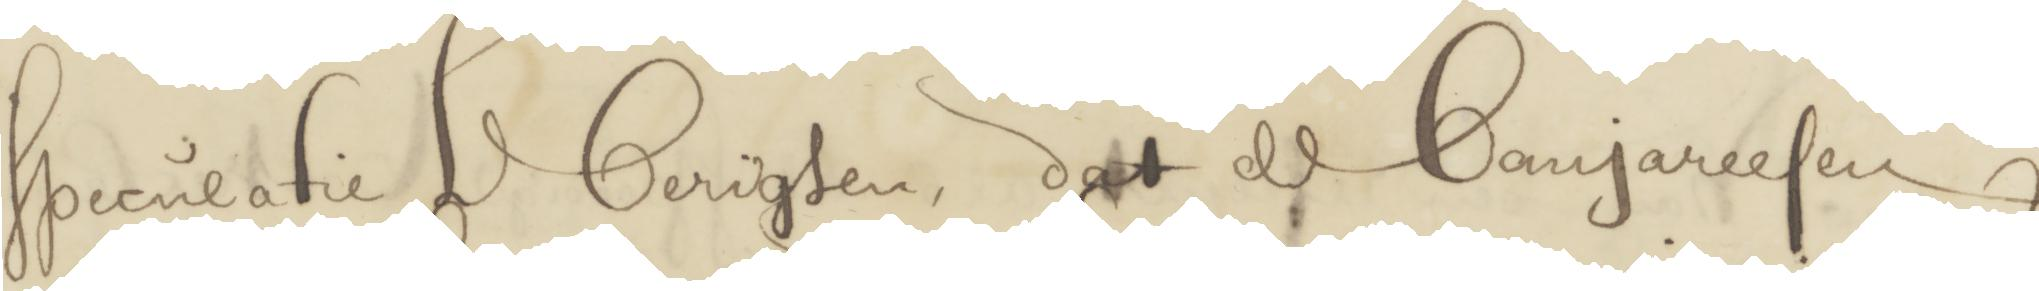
speculatie te berigten, dat de banjareesen
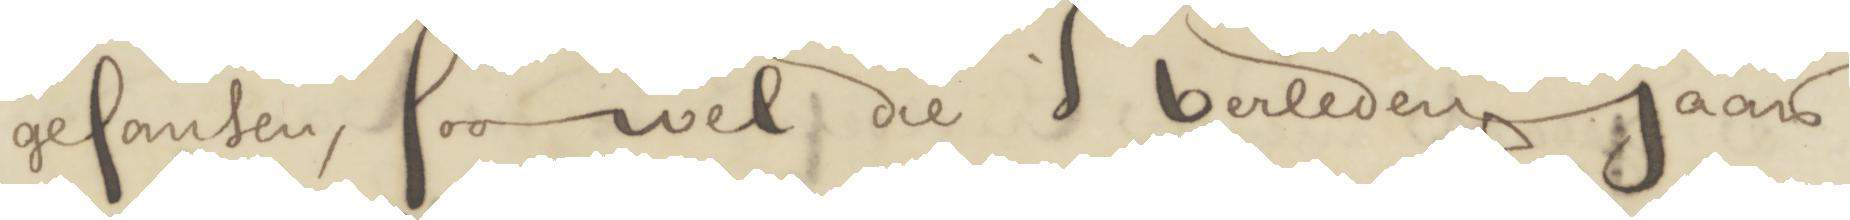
gesanten, soo wel die ’t verleden jaar
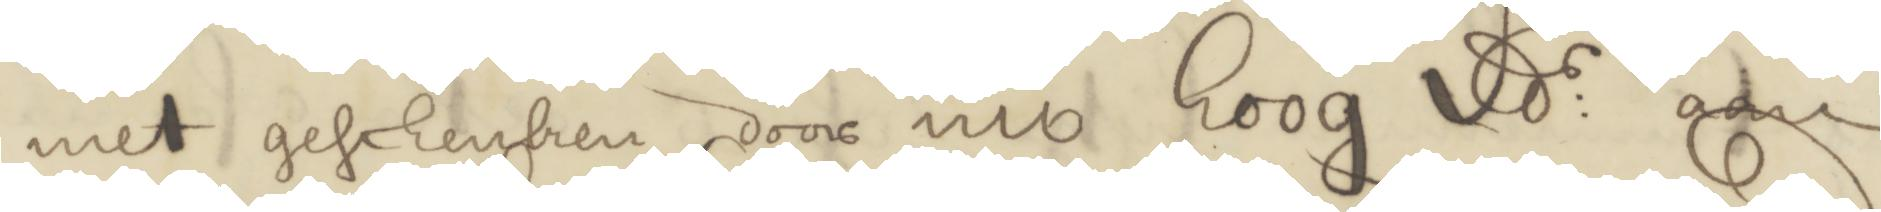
met geschenken door uw hoog Ed:s aan
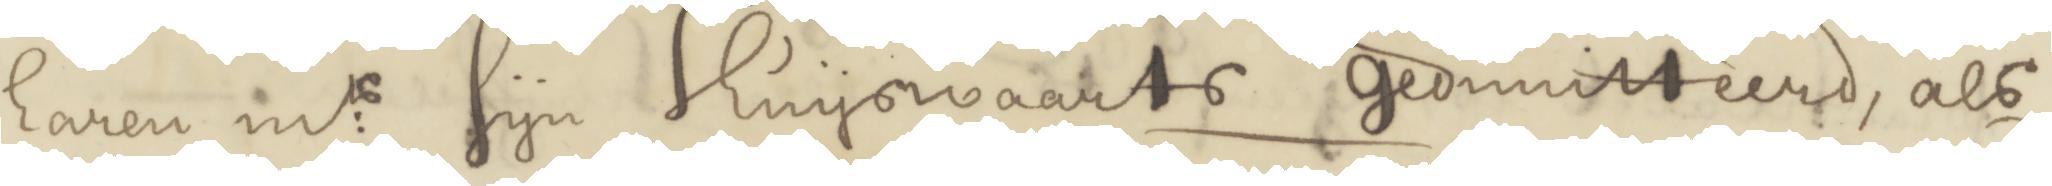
haren m:r sijn thuijswaarts gedimitteerd, als
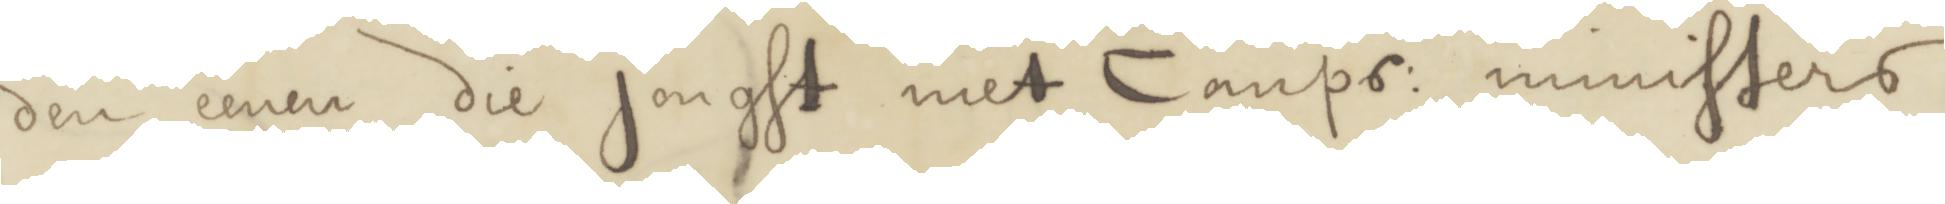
den eenen die jongst met Comps: ministers
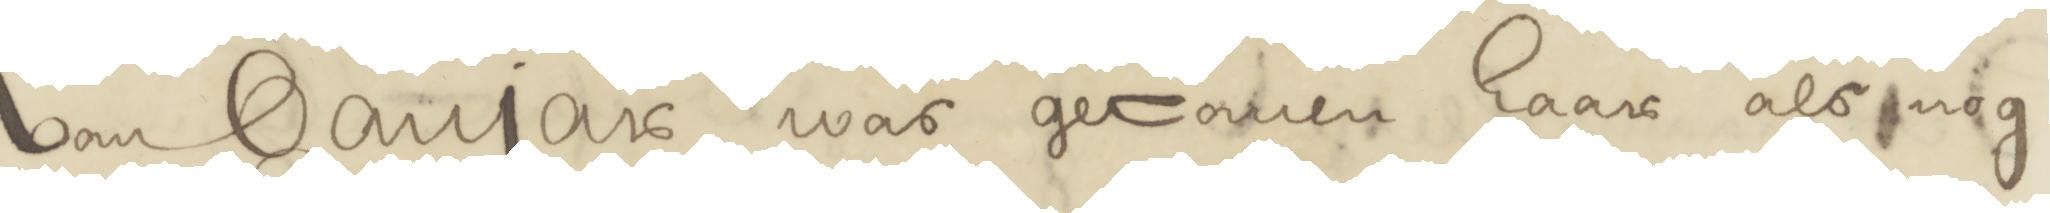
van banjar was gecomen haar als nog
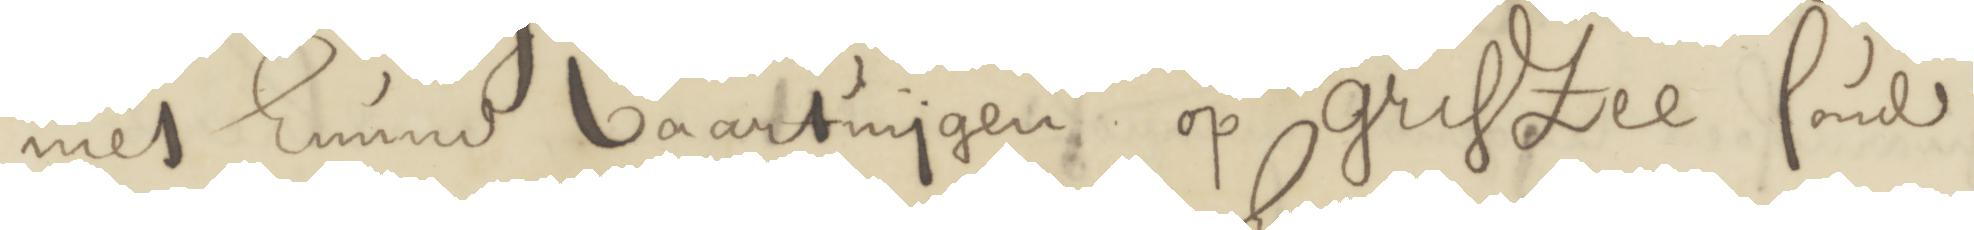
met hunne vaartuijgen op griszee soude
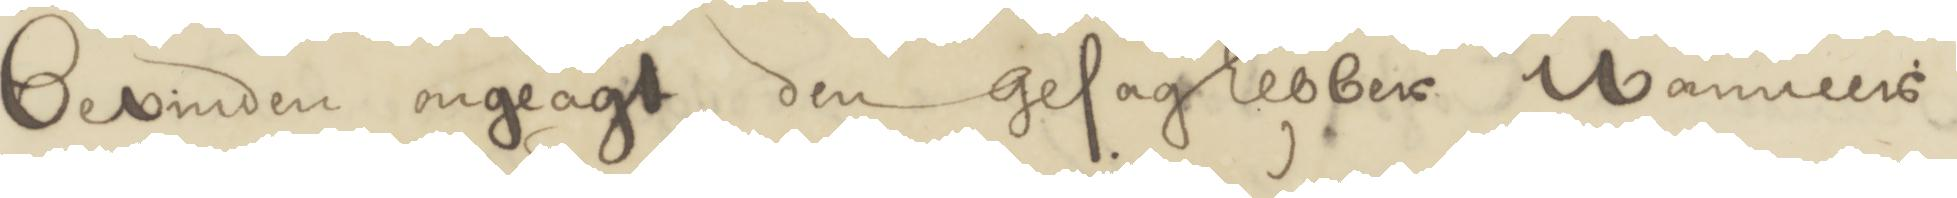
bevinden ongeagt den gesaghebber wanneer
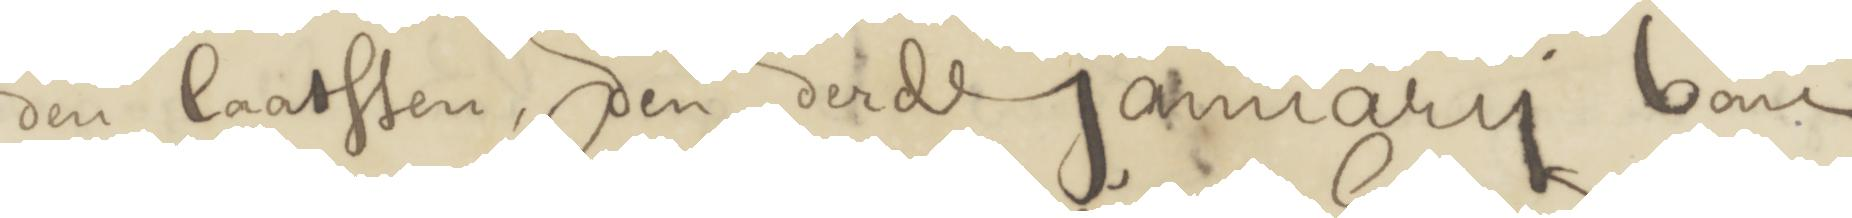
den laatsten, den derde januarij van
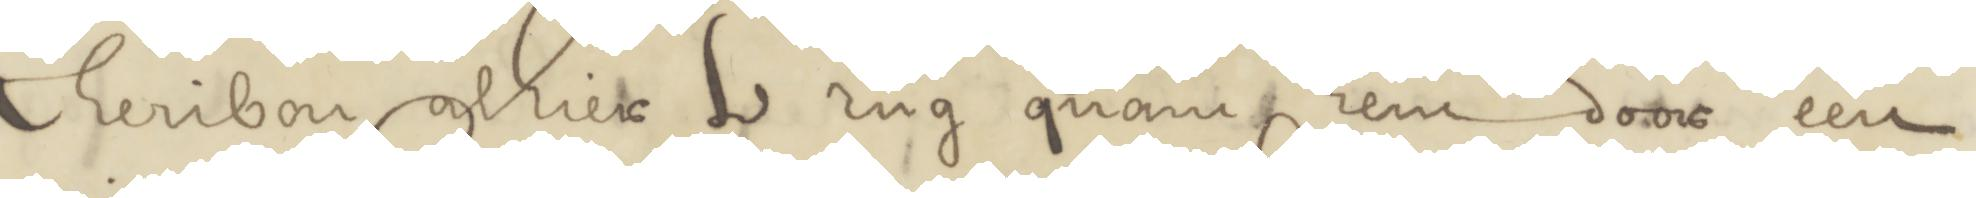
Cheribon alhier te rug quam hem door een
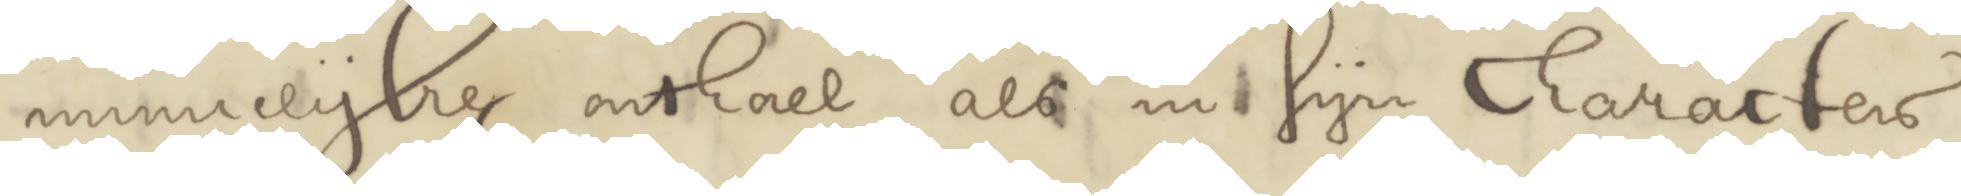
minnelijke onthael als in sijn Character
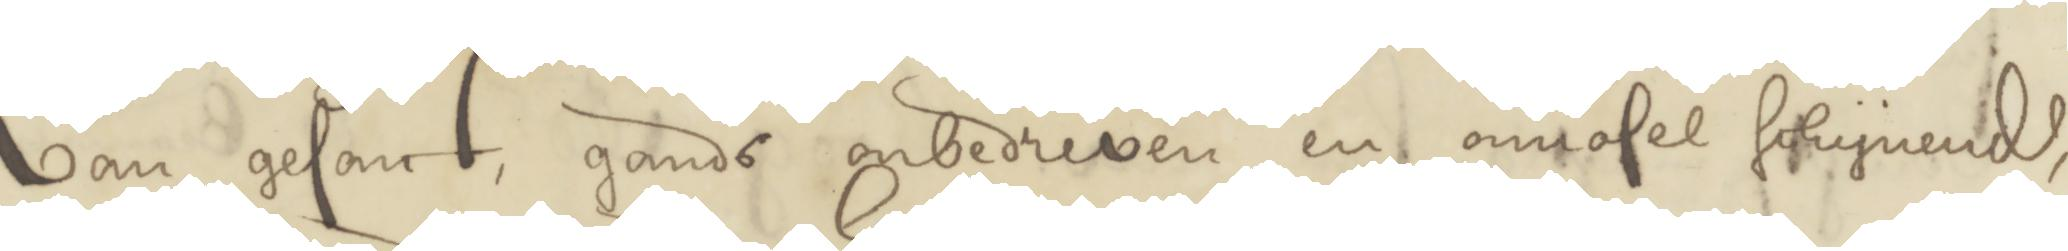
van gesant, gands onbedreven en onnosel schijnend
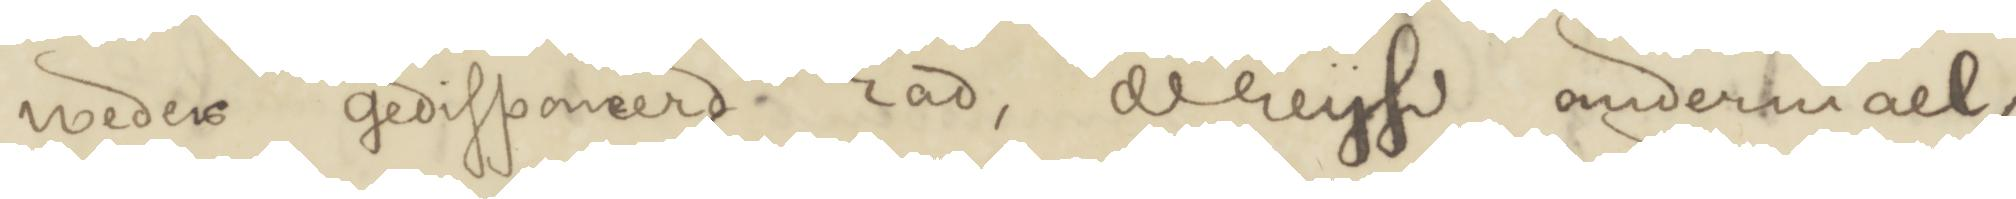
weder gedisponeerd had, de reijse andermael
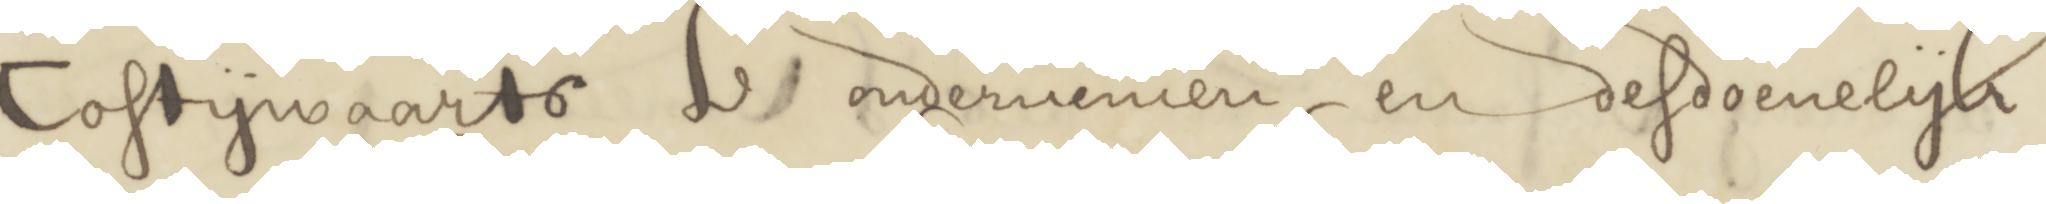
Costijwaarts te ondernemen en desdoenelijk
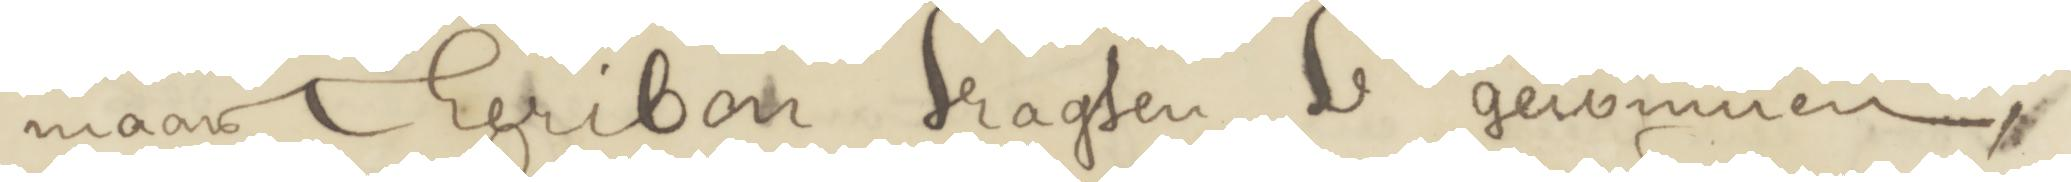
maar Cheribon tragten te gewinnen,
